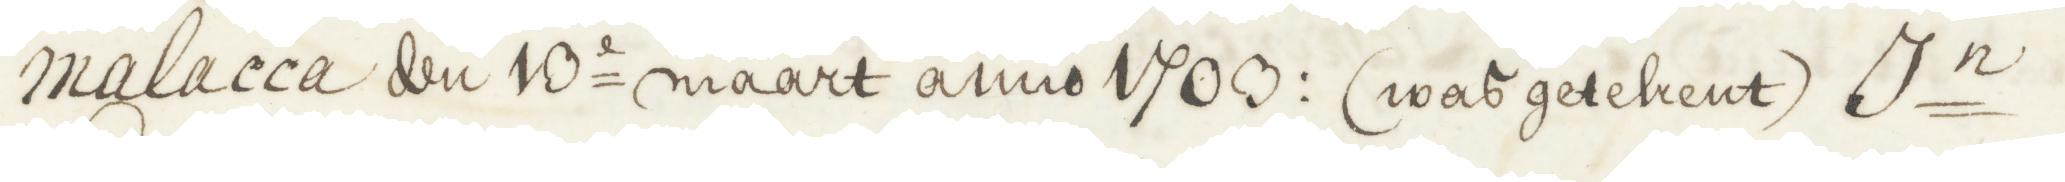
malacca den 13=e maart anno 1703: (was getekent) J=n
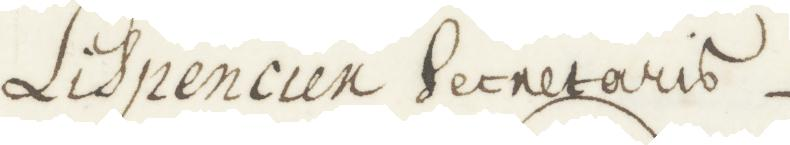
Lispencier Secretaris
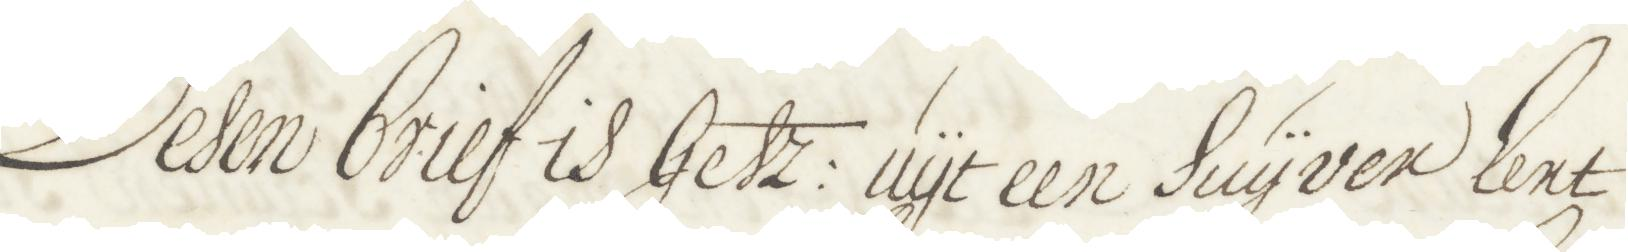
Desen brief is gesz: uijt een suijver hert
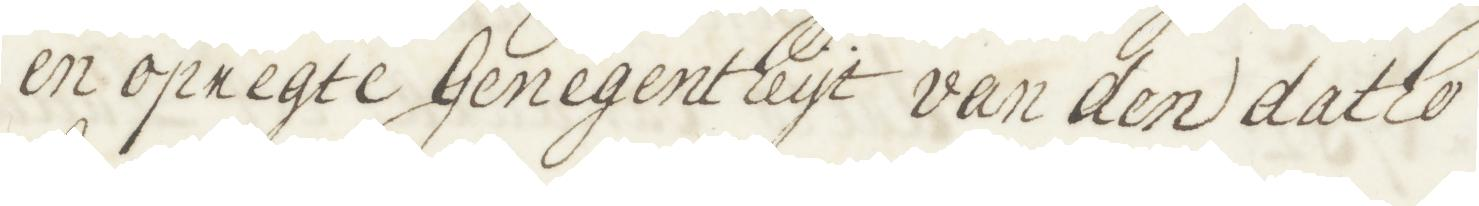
en opregte genegentheijt van den datho
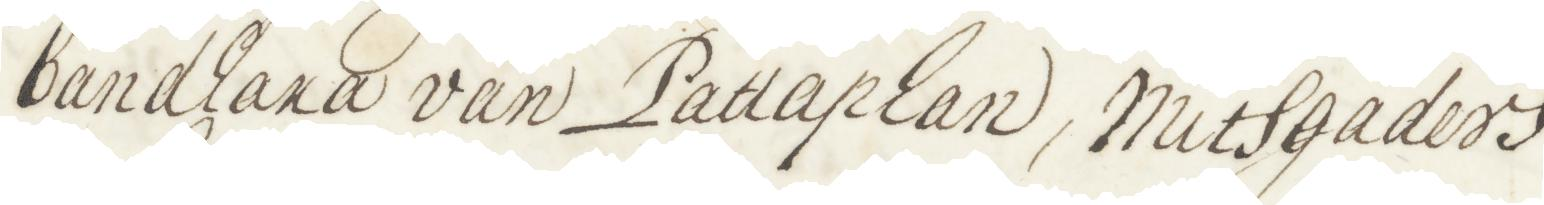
bandhara van Pattaplan, mitsgaders
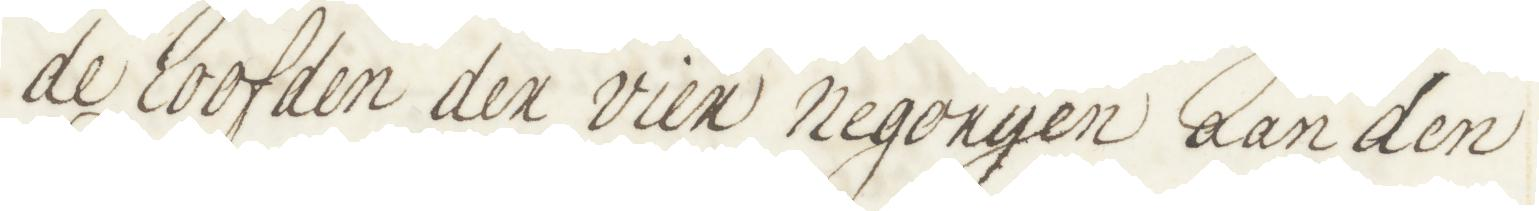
de hoofden der vier negorijen aan den
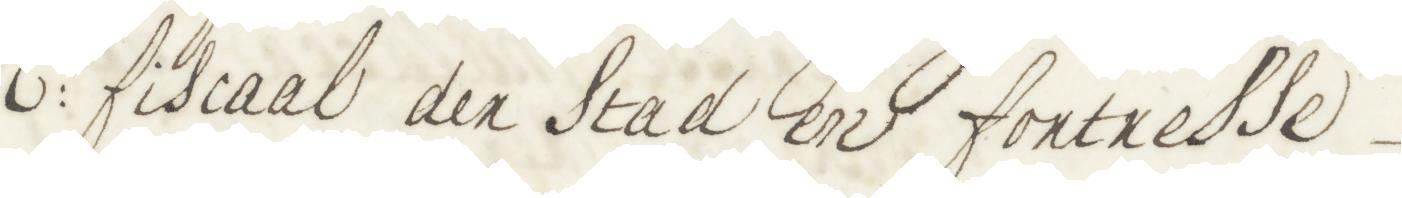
E: fiscaal der stad en fortresse
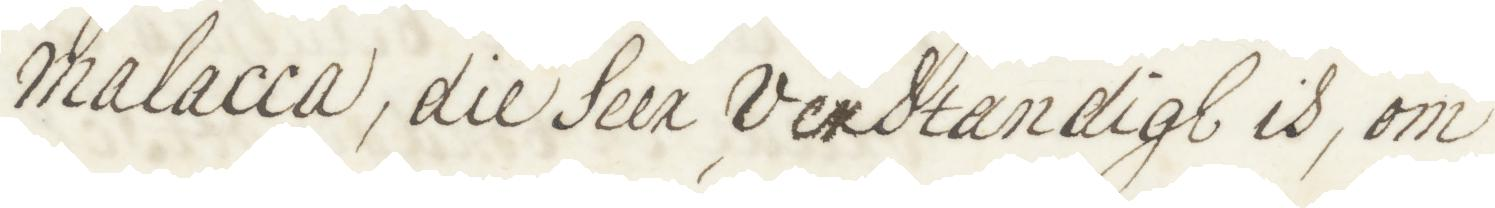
malacca, die seer verstandigh is, om
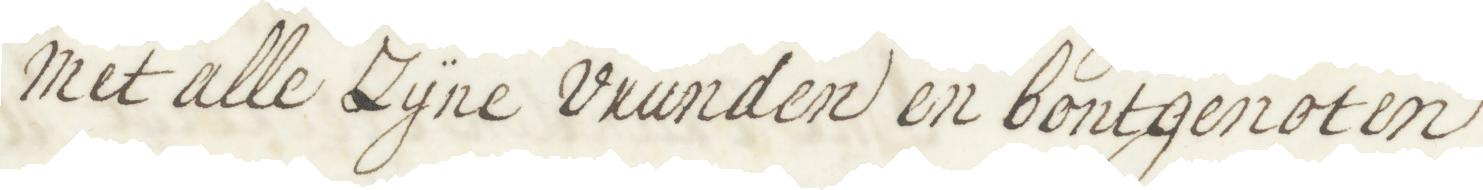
met alle zijne vrunden en bontgenoten
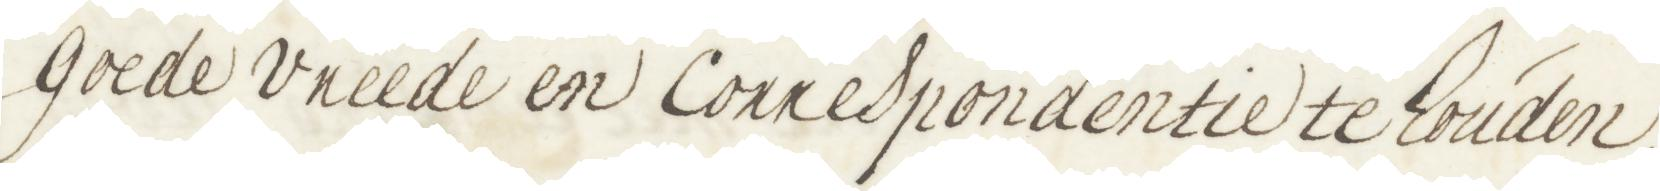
goede vreede en correspondentie te houden,
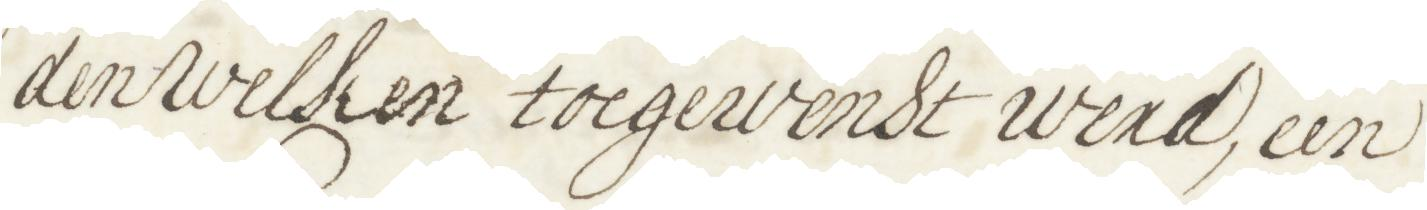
den welken toegewenst werd, een
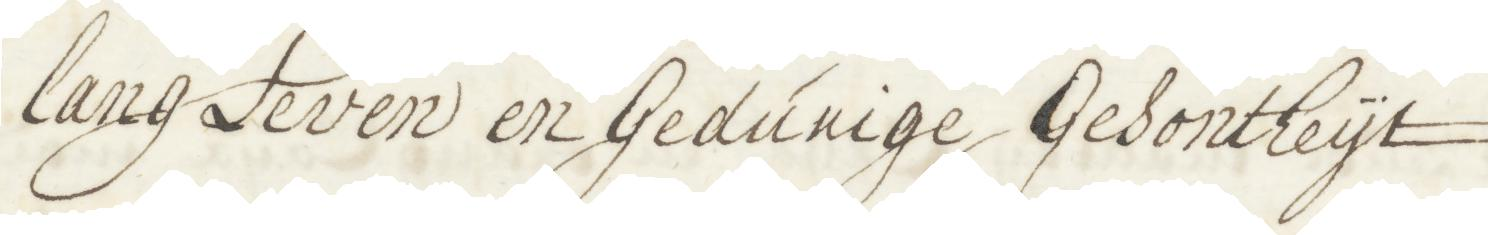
lang Leven en Gedurige Gesontheijt
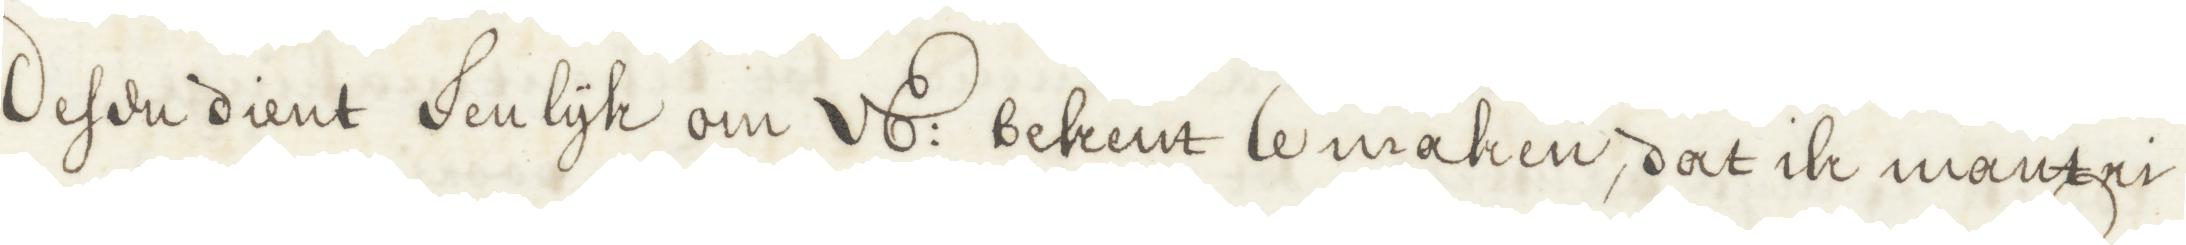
Desen dient Eenlijk om vE: bekent te maken, dat ik mantri
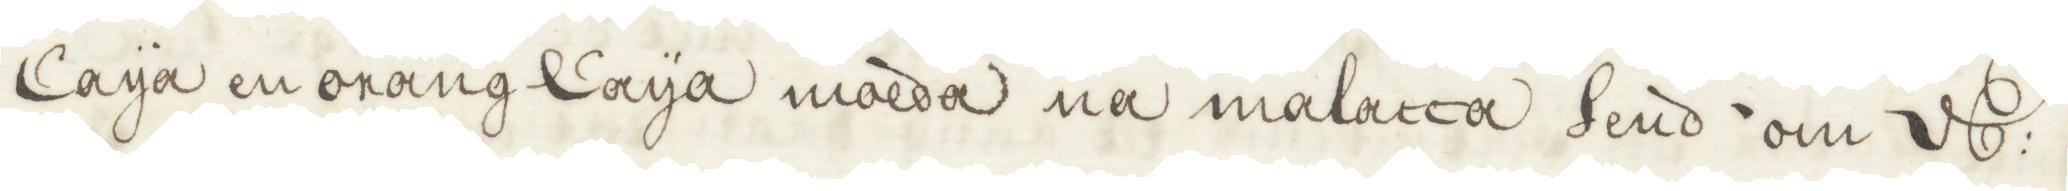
Kaija en orang Kaija moeda na malacca send om vE:
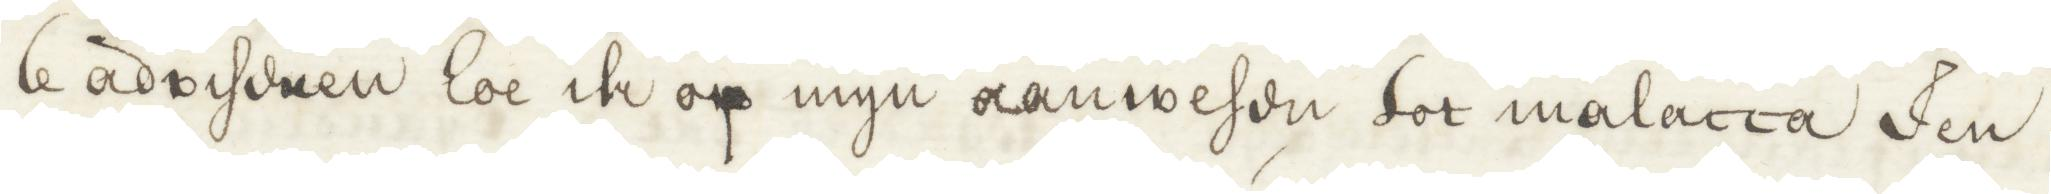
te adviseren hoe ik op mijn aanwesen tot malacca Een
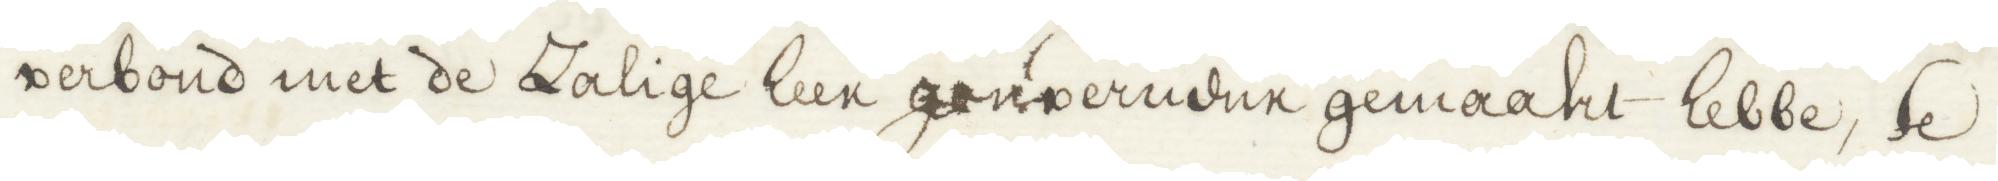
verbond met de zalige heer gouverneur gemaakt hebbe, te
